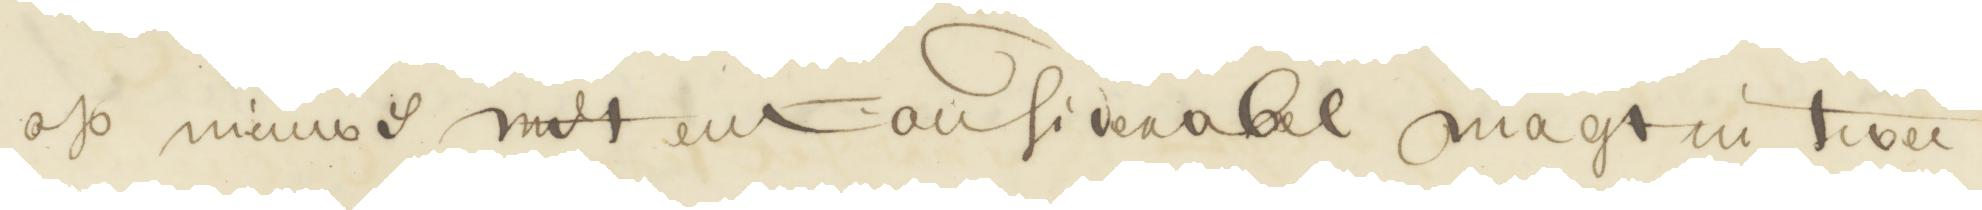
op nieuws met en considerabel magt in twee
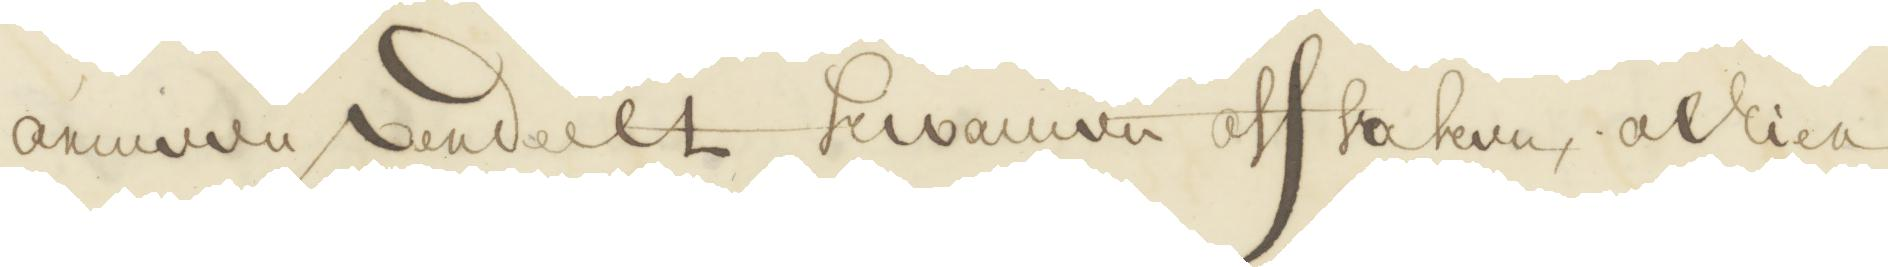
armeen verdeelt kwamen affsaken, alhier
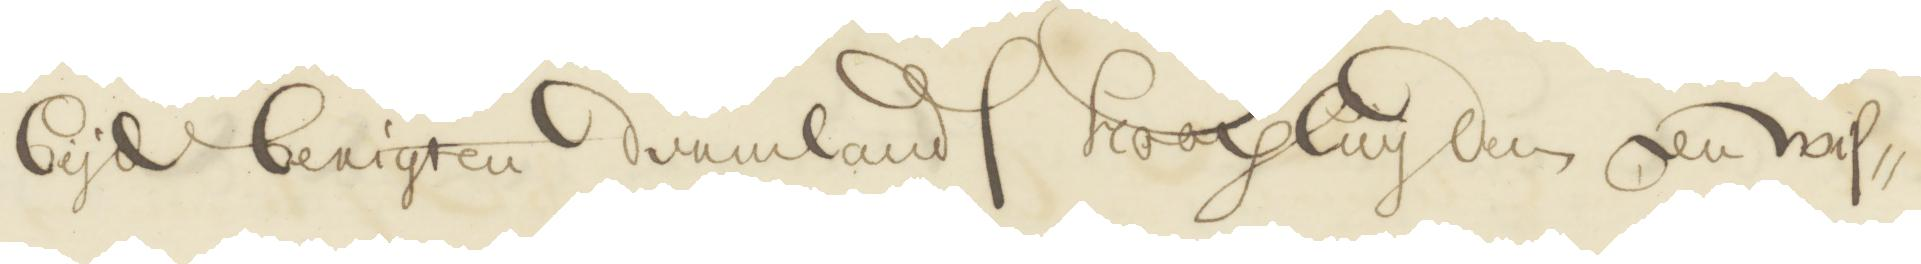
bijde berigten derinlands koopluijden en wis„
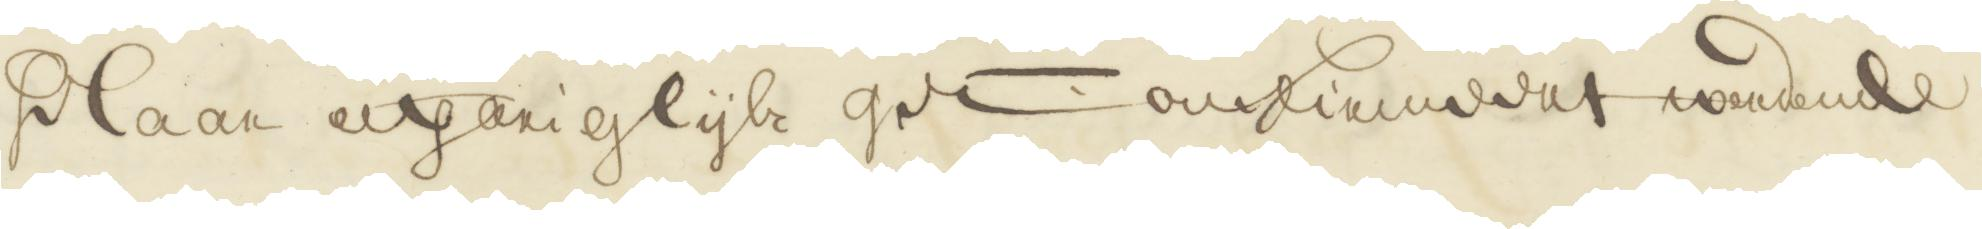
selaar eepariglijk gecomfirmeert werdende
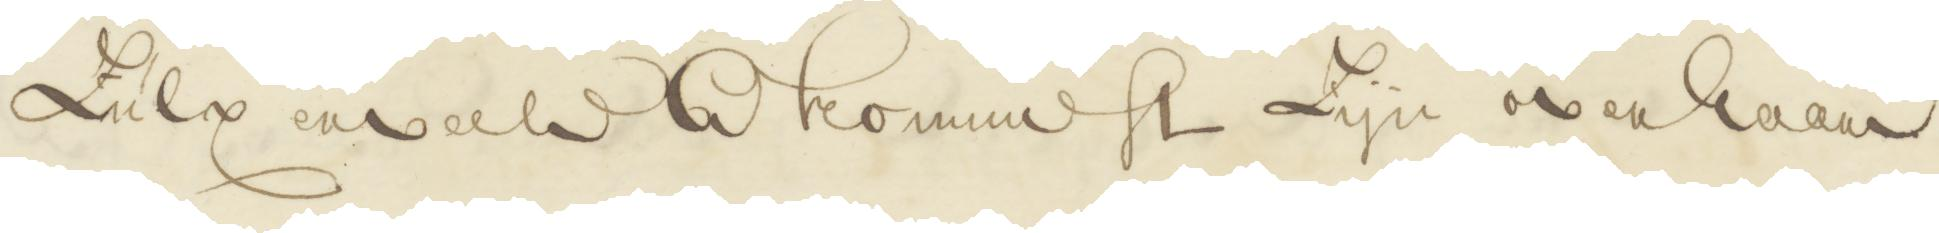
zulx erveele bekommest zijn overhaare
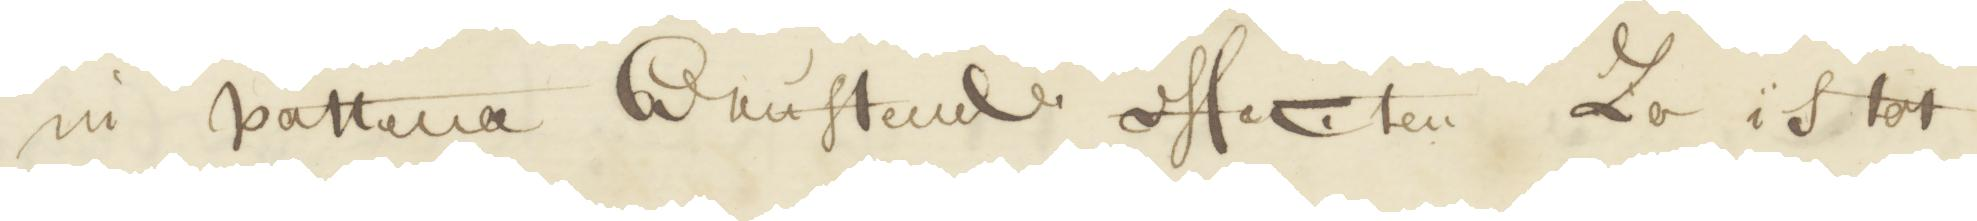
in pattena berustende effecten zo is tot
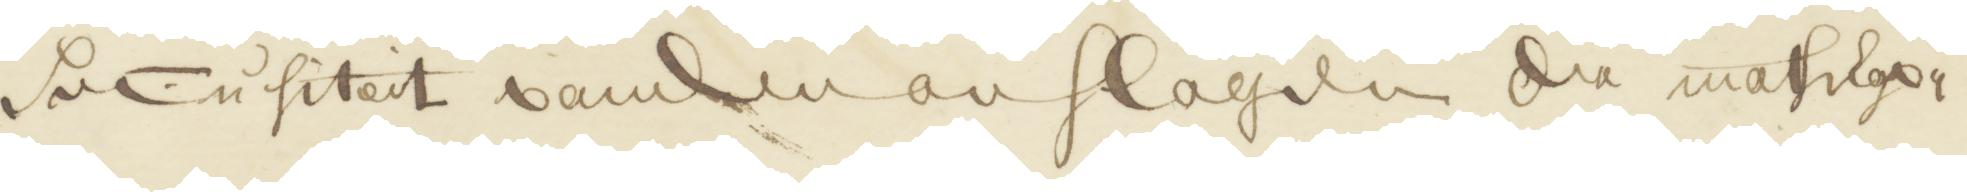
secusiteit vanden onslagen der matschapij
